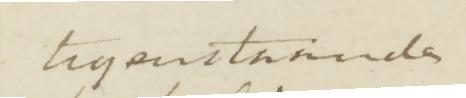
tegenstaande
